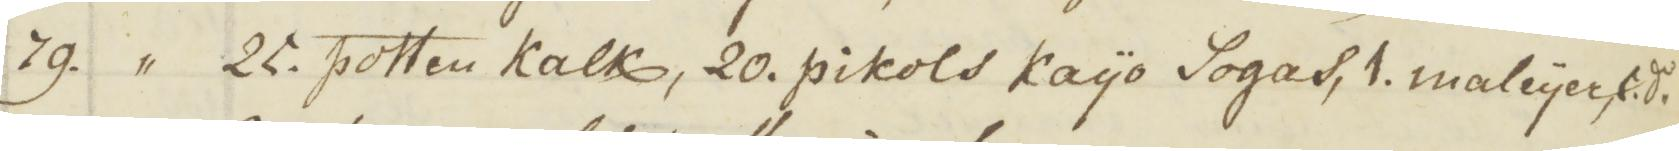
79. „ 25. potten Kalk, 20. pikols Kaijo Sogas, 1. maleijer, 5. d„o
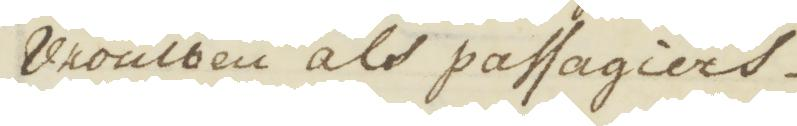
Vrouwen als passagiers
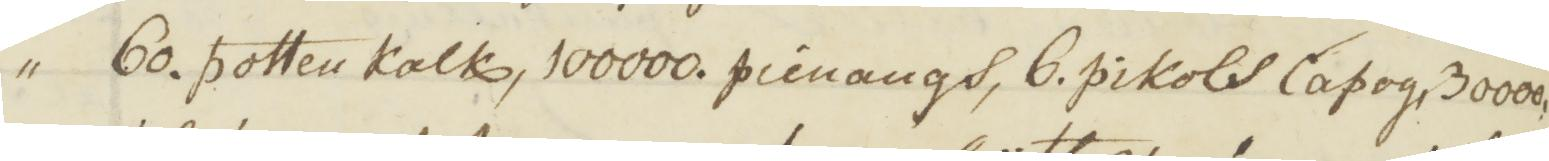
„ 60. potten kalk, 100000. pienangs, 6. pikols Capog, 30000.
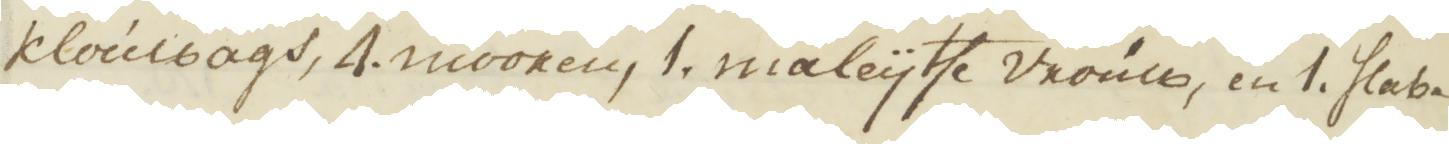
klouwags, 4. mooren, 1. maleijtse vrouw, en 1. slave
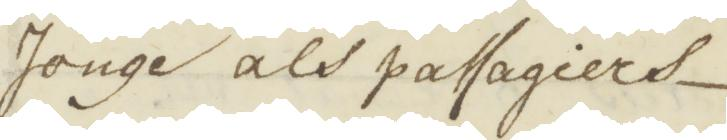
Jonge als passagiers —
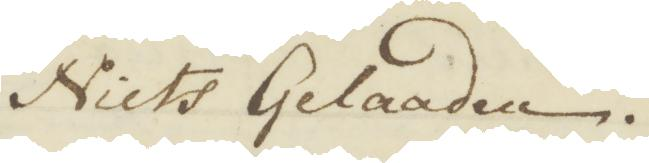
Niets Gelaaden.
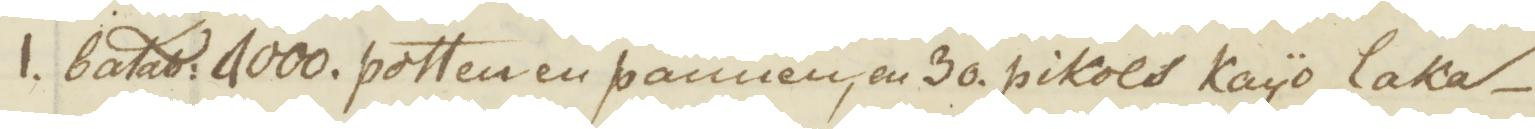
1. batav: 4000. potten en pannen, en 30. pikols Kaijo laka —
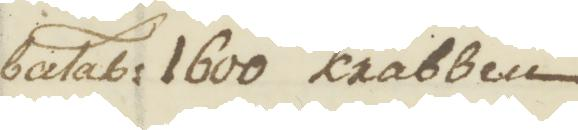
batav: 1600 Krabben
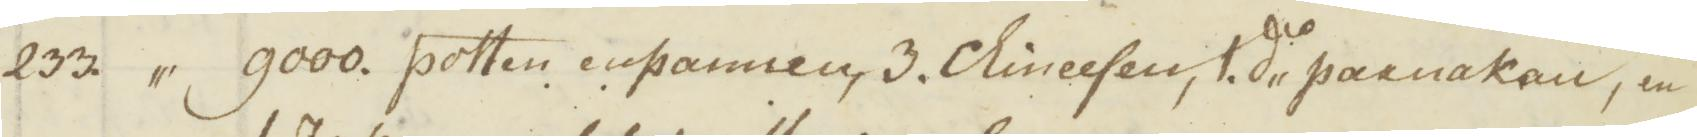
233. „ 9000. potten enpannen, 3. Chineesen, 1. d„o parnakan, en
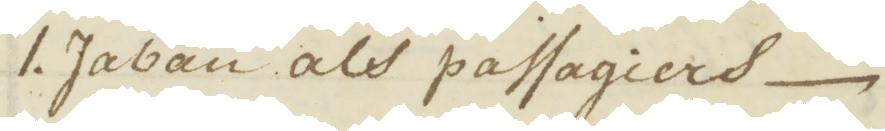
1. Javan als passagiers —
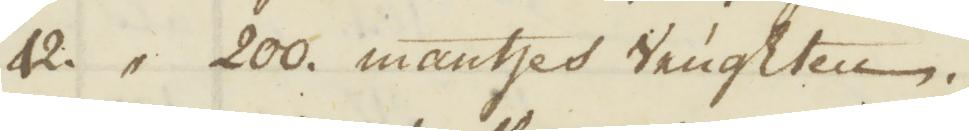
42. „ 200. mantjes Vrughten.
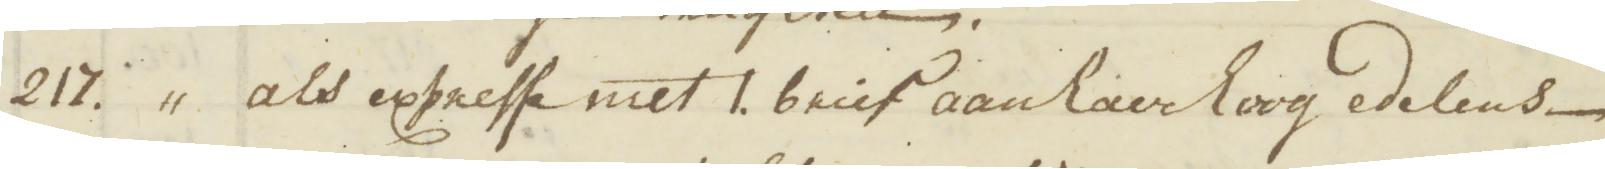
217. „ als expresse met 1. brief aan haer hoog edelens —
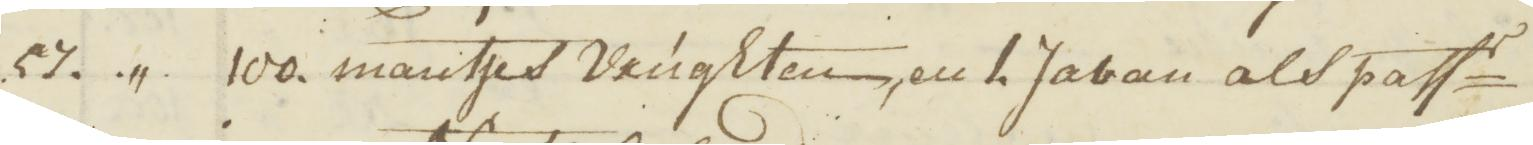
57. „ 100. mantjes Vrughten, en 1. Javan als pass=s
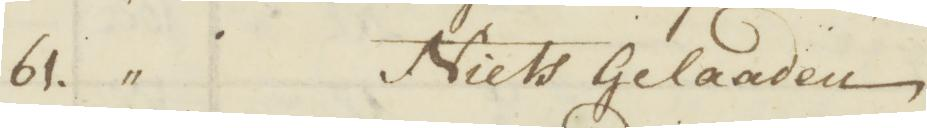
61. „ Niets Gelaaden
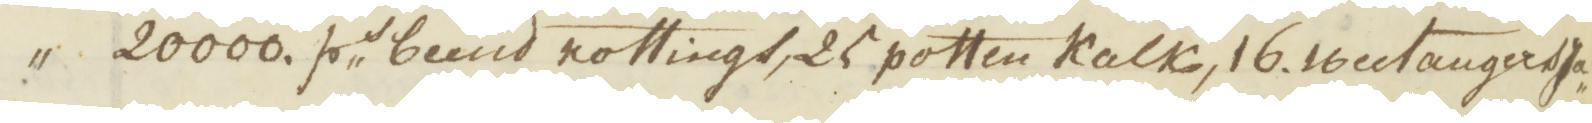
„ 20000. p„s beend rottings, 25 potten Kalk, 16. weetangers Ja„
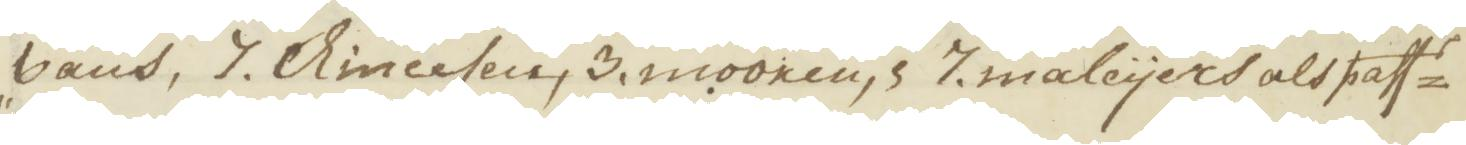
„vans, 7. Chineesen, 3. mooren, en 7. maleijers als pass=s
